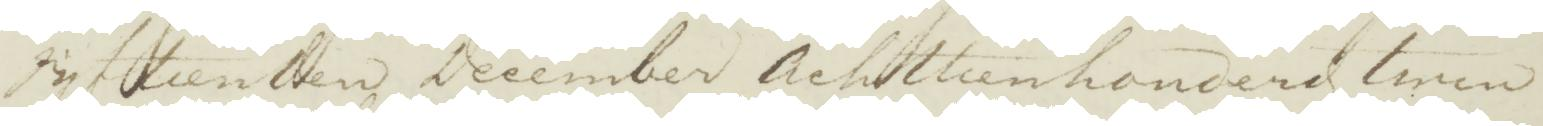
Vijftienden December Achttienhonderd twin
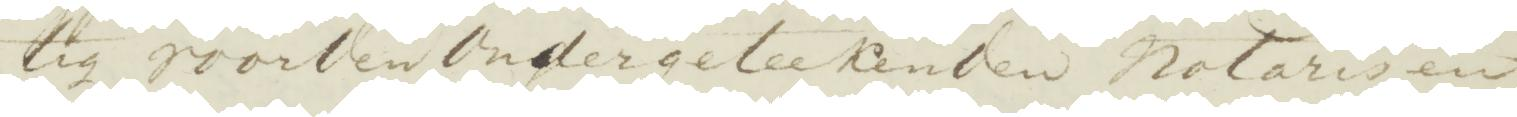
tig voorden Ondergeteekenden Notaris en
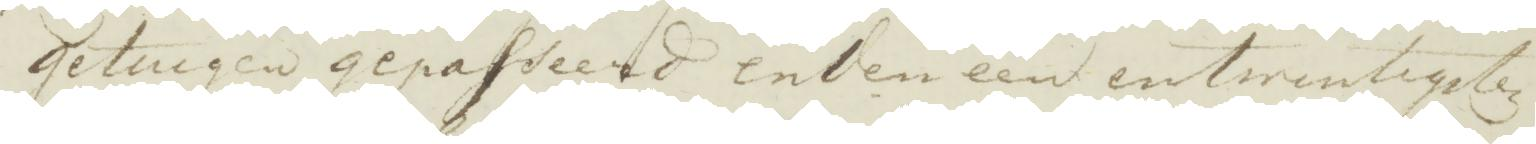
getuigen gepasseerd en den een entwintigsten
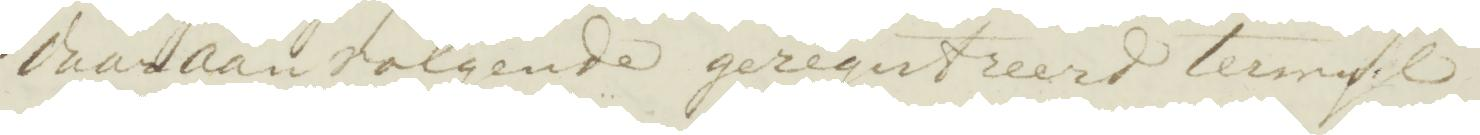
daar aan volgende geregistreerd terwyl
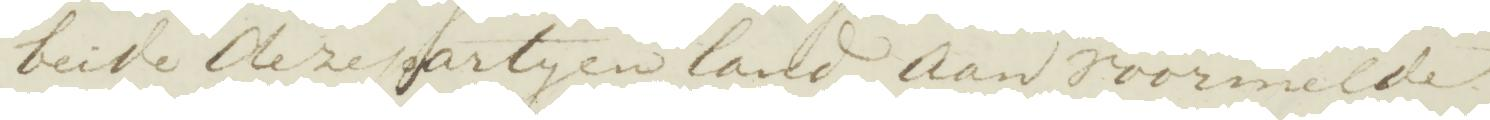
beide deze partyen land aan voormelde
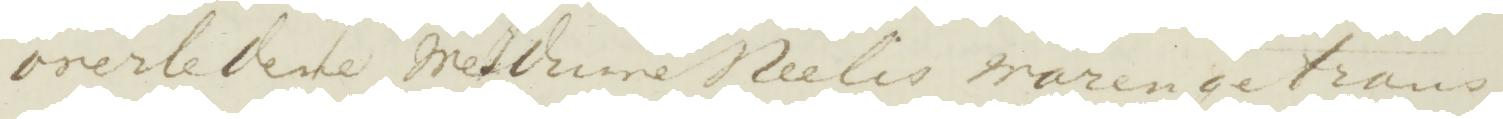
overledene Weduwe Neelis waren getrans
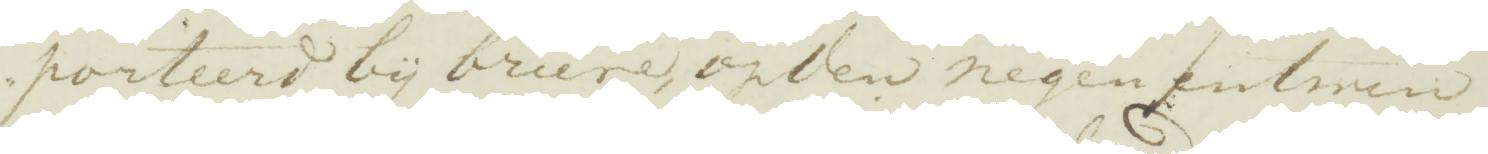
„porteerd bij brieve, op den negen entwin
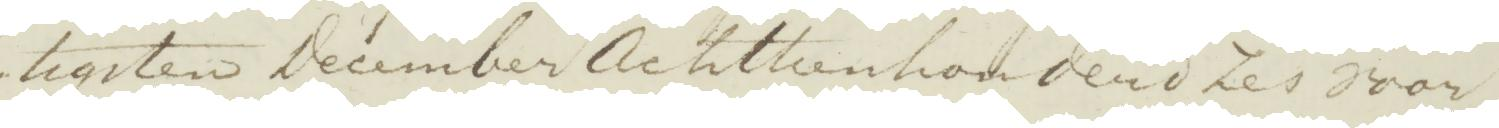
„tigsten December Achttienhonderd zes voor
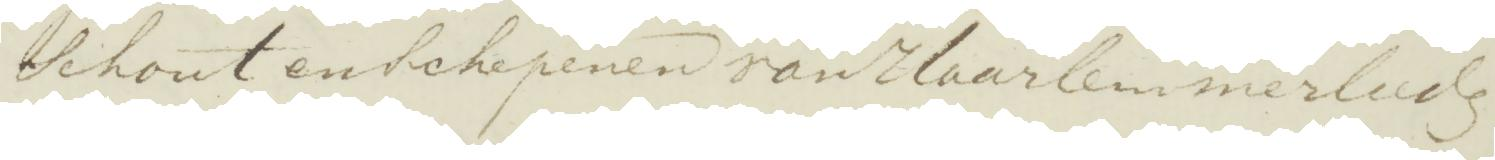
schout en schepenen van Haarlemmerliede
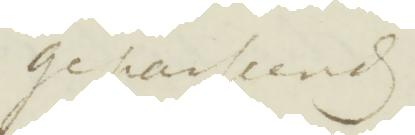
gepasseend
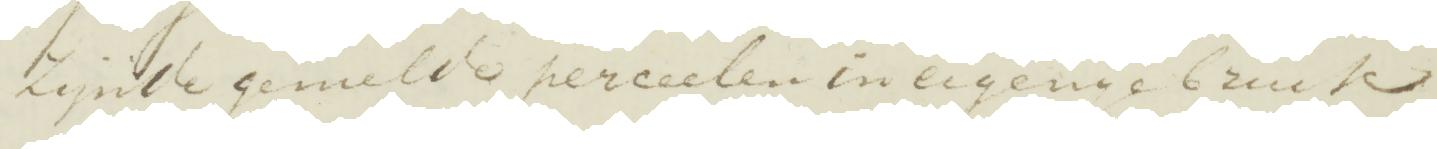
Zijnde gemelde perceelen in eigenge bruik
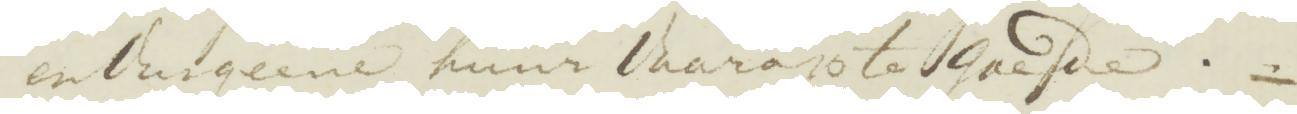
en dusgeene huur daarop te goede. —
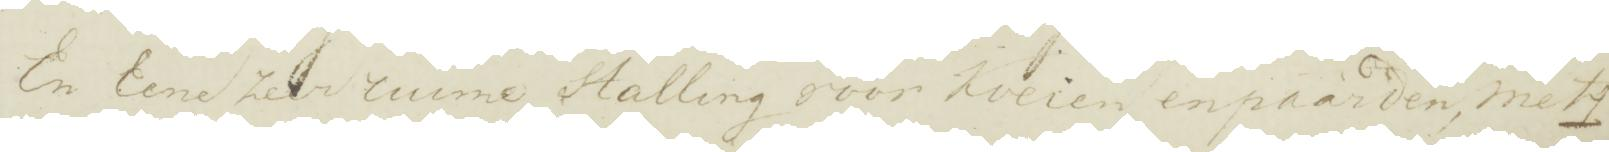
En Eene zeer ruime stalling voor koeien en paarden, met¶
